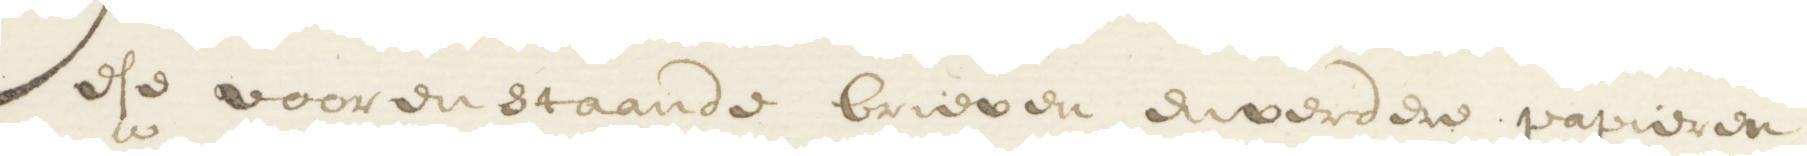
Dese voor en staande brieven enverdere papieren
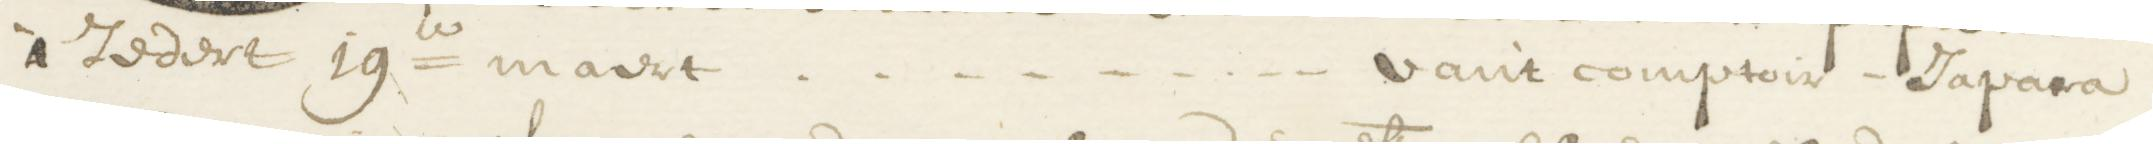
't zedert 19=e maert - - - - - - - - - van’t comptoir - Japara
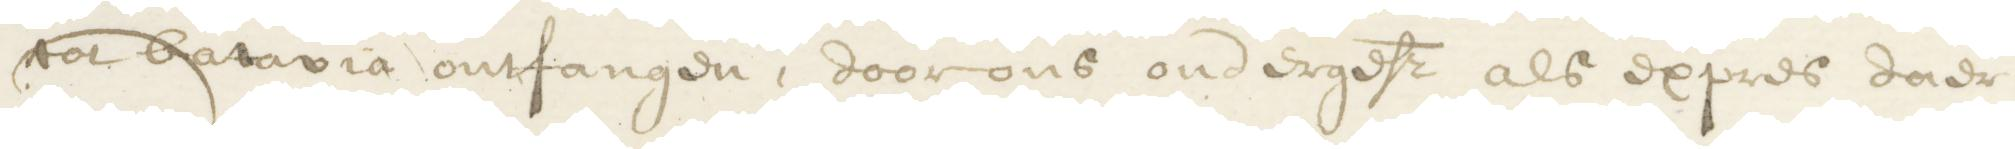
tot batavia ontfangen, door ons ondergesz als expres daer
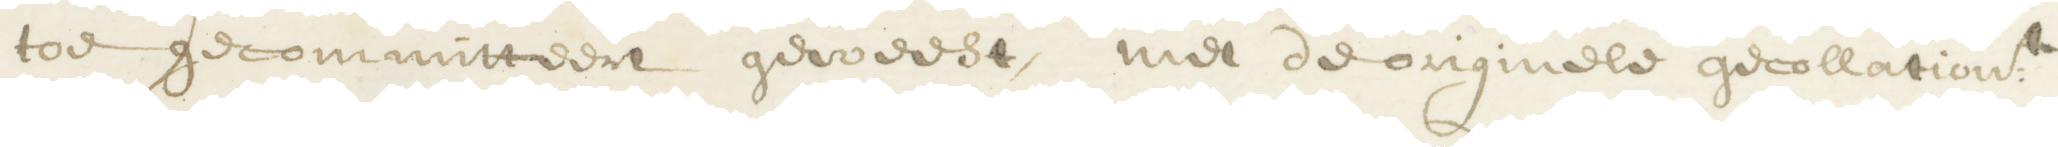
toe gecommitteert geweest, met de originele gecollation:t
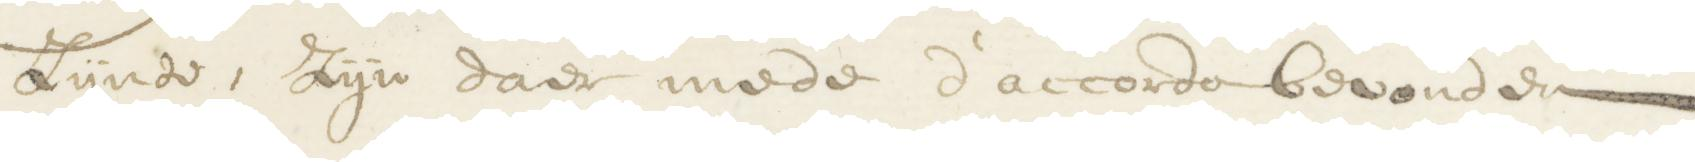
zijnde, zijn daer mede d’accordo bevonden
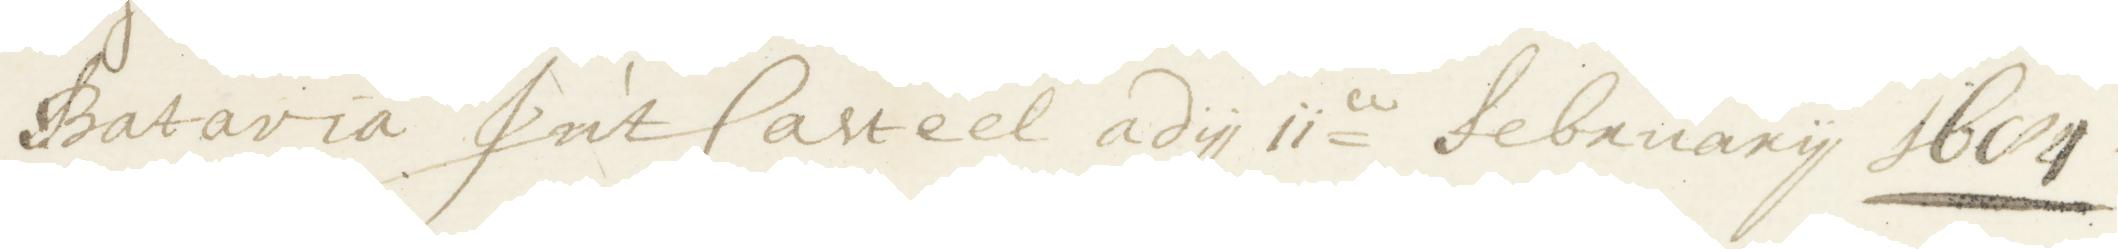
Batavia Jn't Casteel adij 11=e februarij 1684
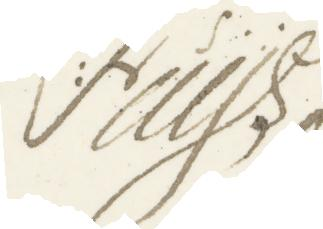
Fuijs:
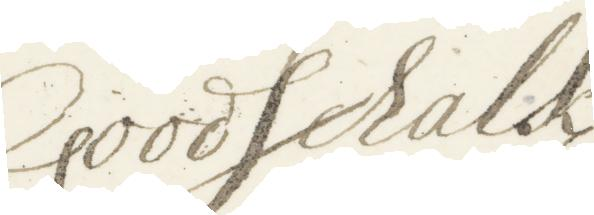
Goodschalk
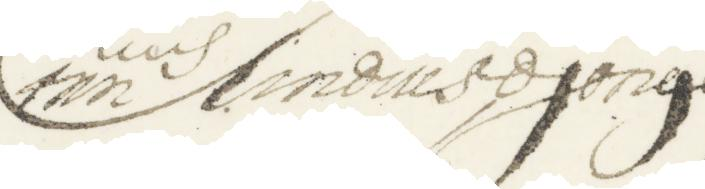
van Sindiusd'jong
